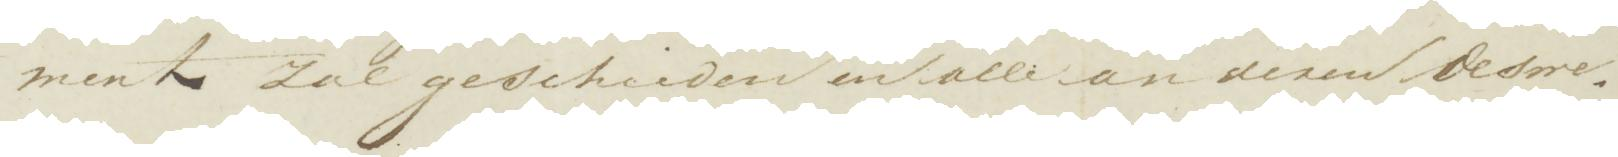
.ment zal geschieden en alle anderen deswe„
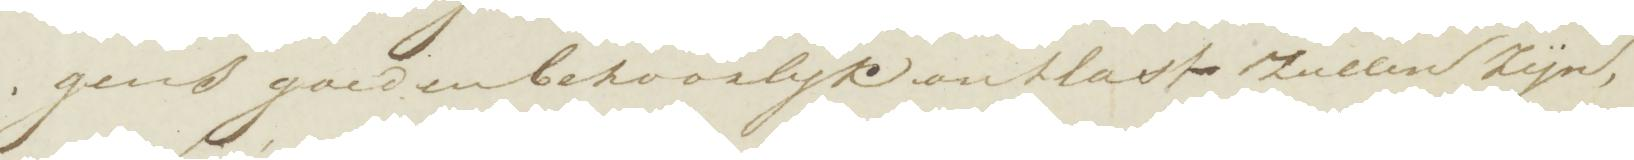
.gens goed en behoorlyk ontlast zullen zijn,
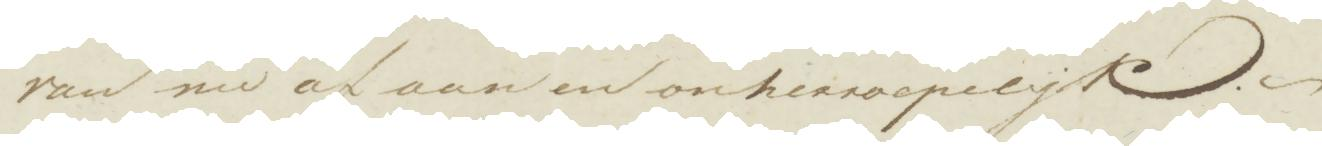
van nu af aan en onherroepelijk.
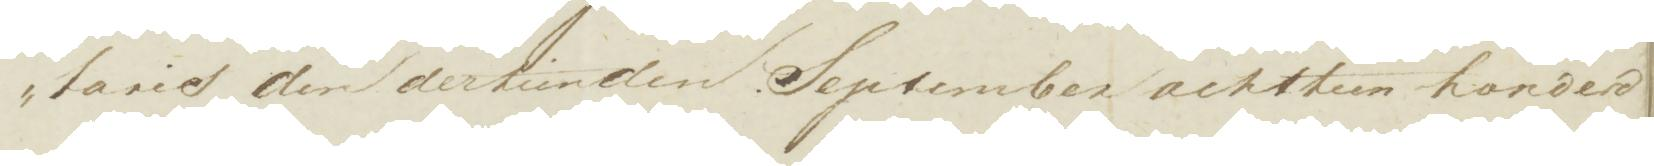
„taris den dertienden September achttien honderd
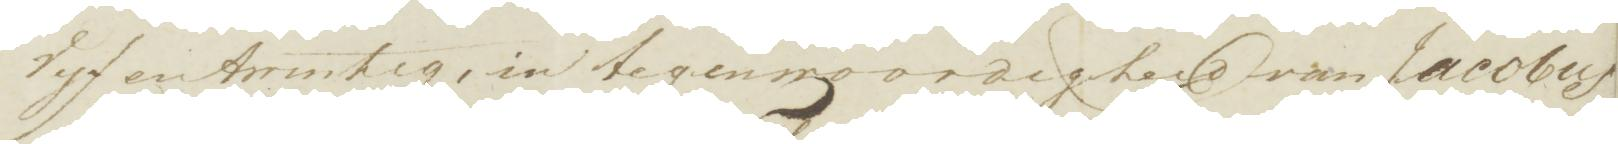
Vyf entwintig, in tegenwoordigheid van Jacobus
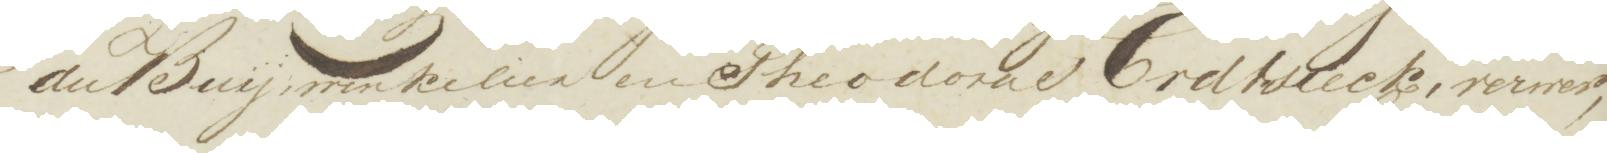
du Buij, winkelier en Theodorus Erdtsieck, verwer,
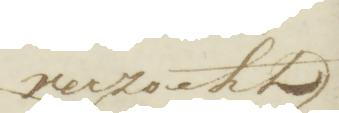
verzocht
